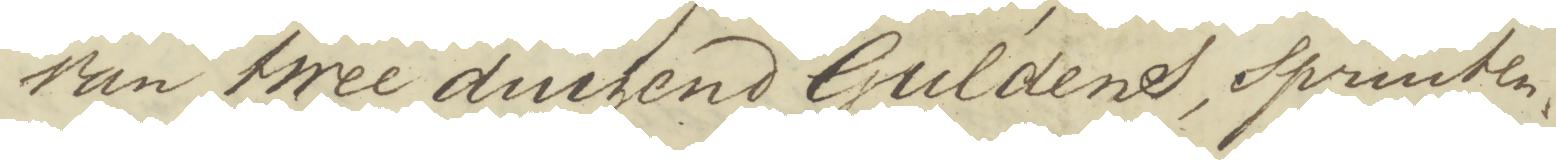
van twee duizend Guldens, spruiten„
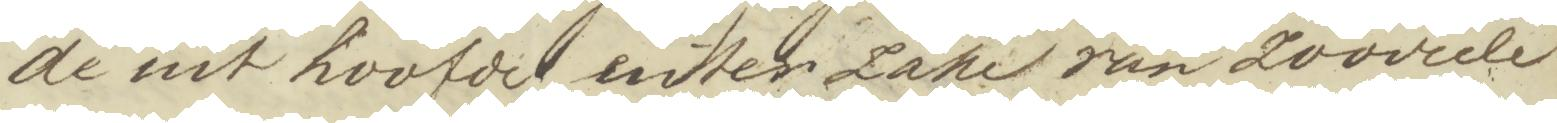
de uit hoofde en ter zake van zooveele
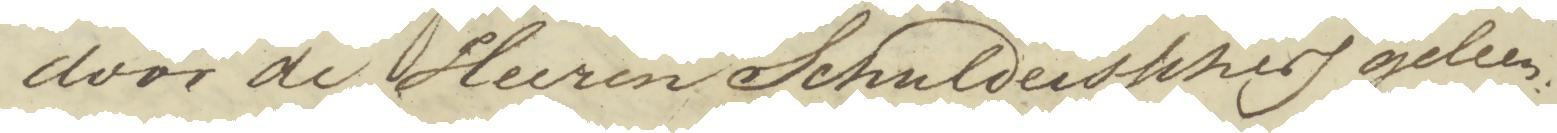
door de Heeren Schuldeisschers geleen„
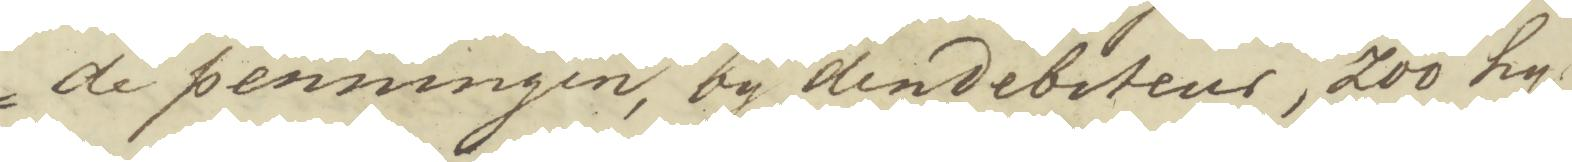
„de penningen, by den debiteur, zoo hy
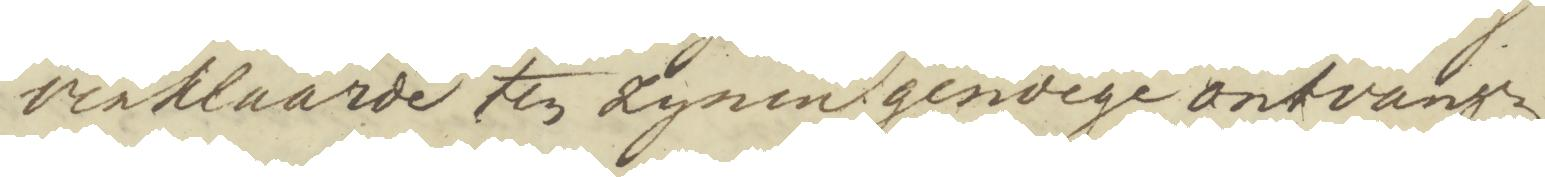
verklaarde ten zynen genoege ontvangen
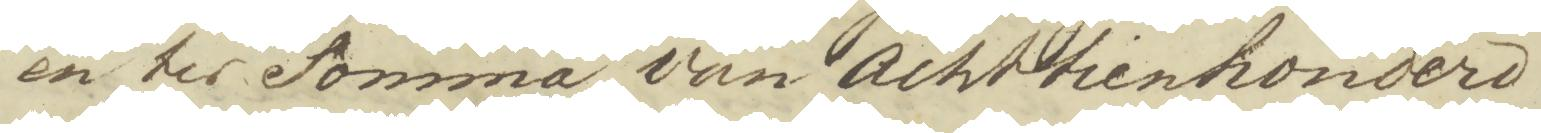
en ter somma van achttienhonderd
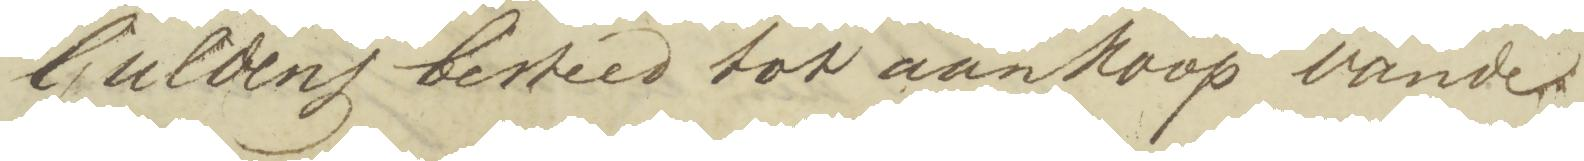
Guldens besteed tot aankoop van de
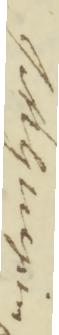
JM. Guepin
